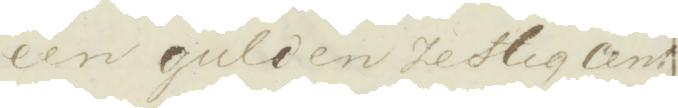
een gulden zestig cents
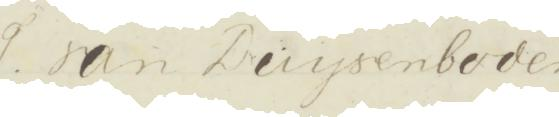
J. van Duijvenboden
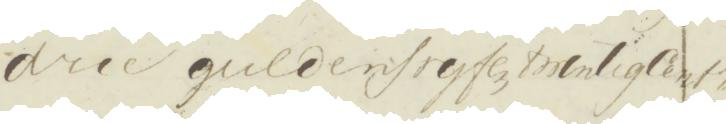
drie gulden vyfentwintig cents
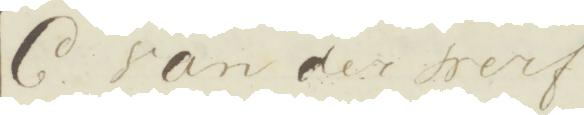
C. van der werf
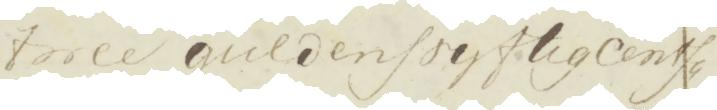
twee guldens vyftig cents„
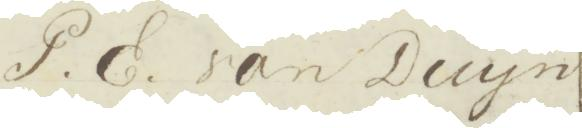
P. E. van Duyn
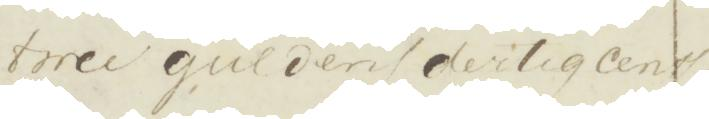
twee guldens dertig cents„
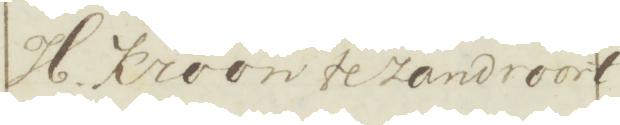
H. Kroon te zandvoort
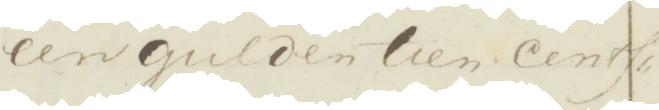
een gulden tien Cents„
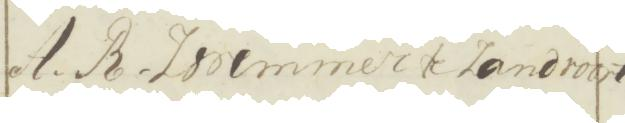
A.R. Zwemmer te Zandvoort
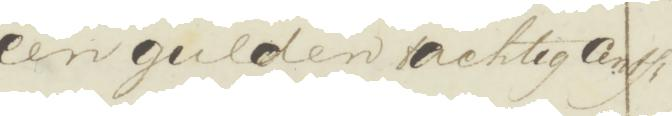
een gulden tachtig Cents„
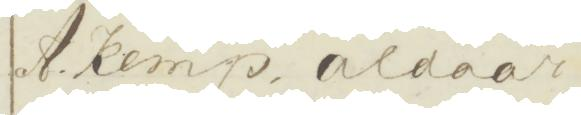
A. Kemp, aldaar
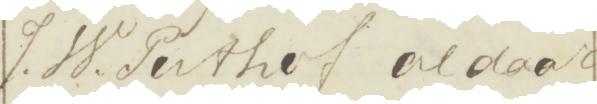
J. W. Puthof aldaar
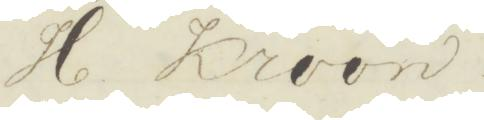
H. Kroon
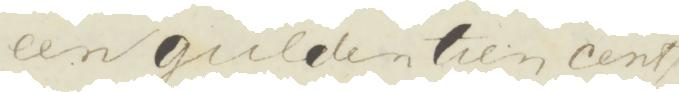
een gulden tien cents
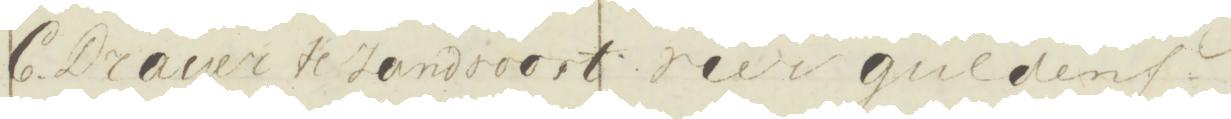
C. Drayer te zandvoort vier guldens.
